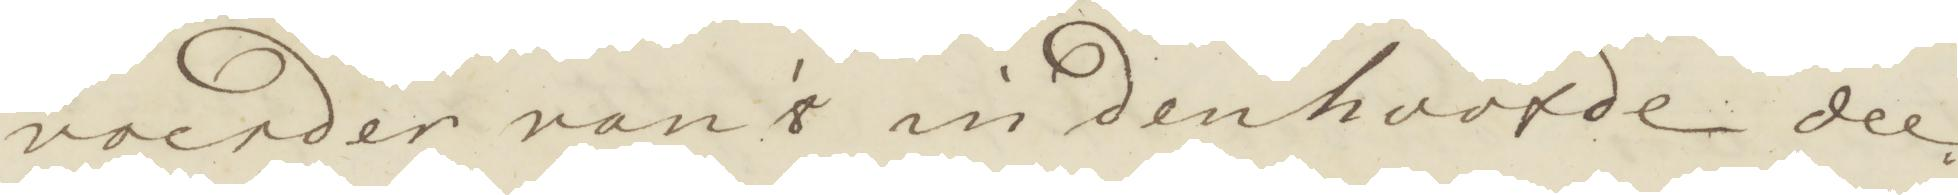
voerder van 't in den hoofde dee„
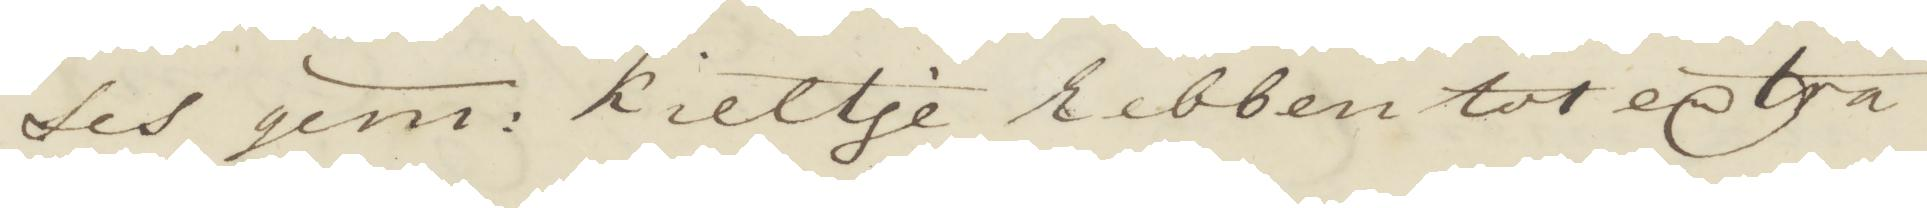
ses gem: Kieltje hebben tot extra
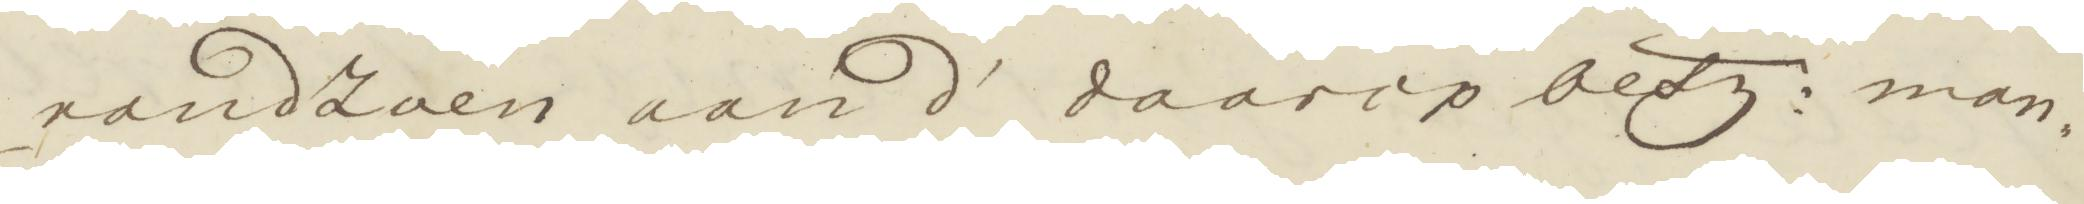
randzoen aan d’ daarop besz: man„
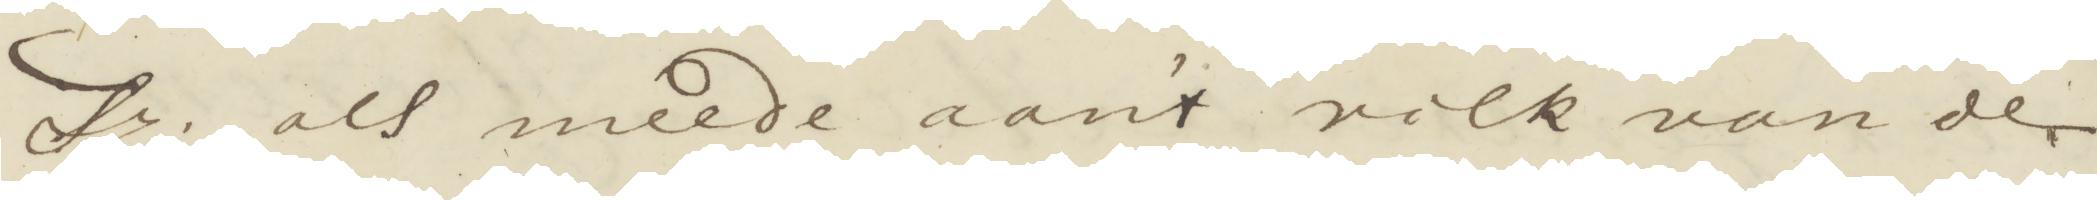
sz: als meede aan't volk van de
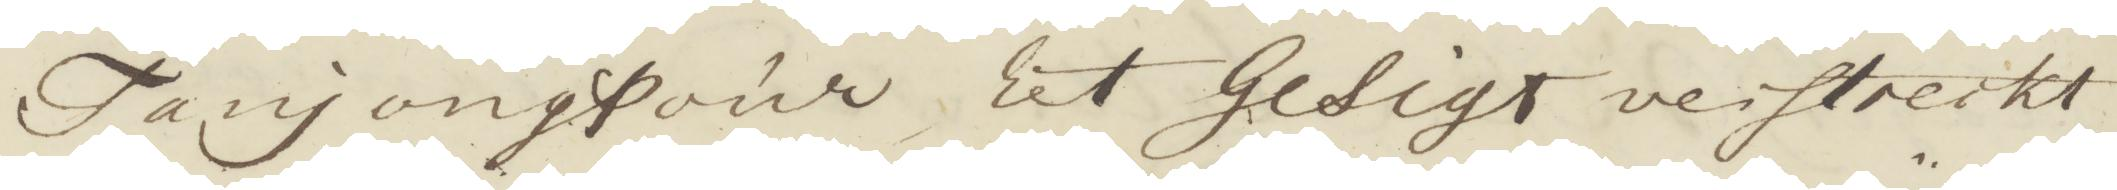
Tanjongpour het gesigt verstreckt
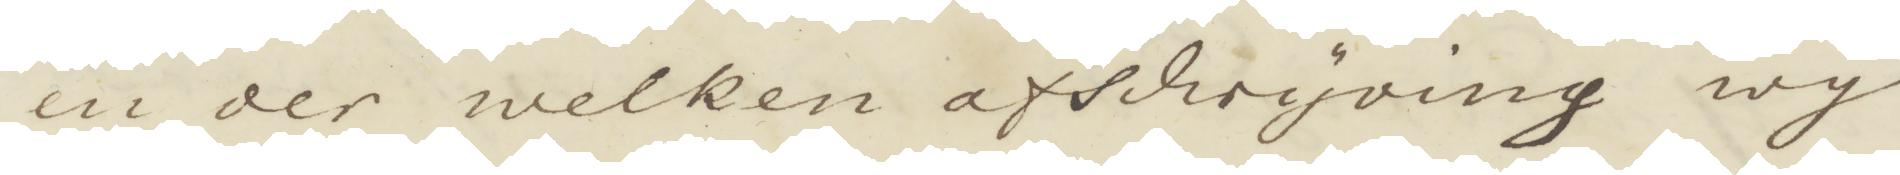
en der welken afschrijving wij
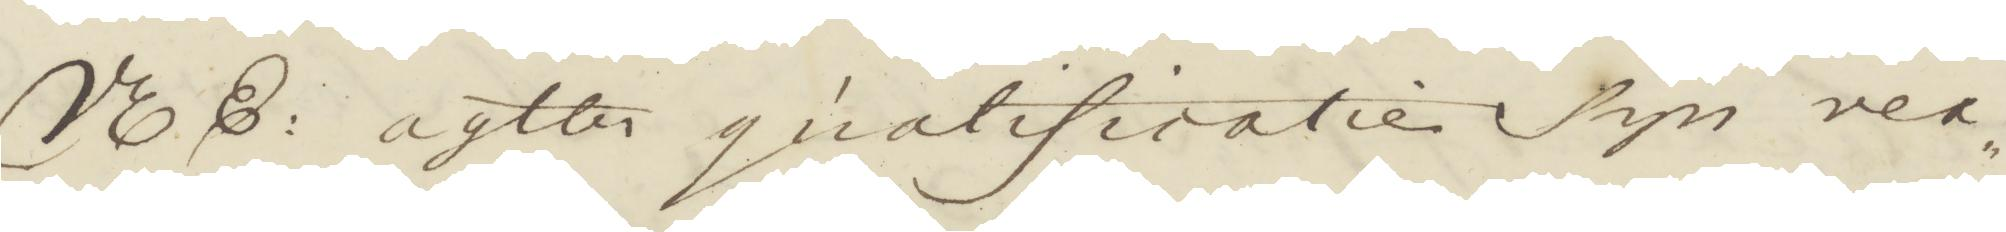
VE E: agtbr qualificatie sijn ver„
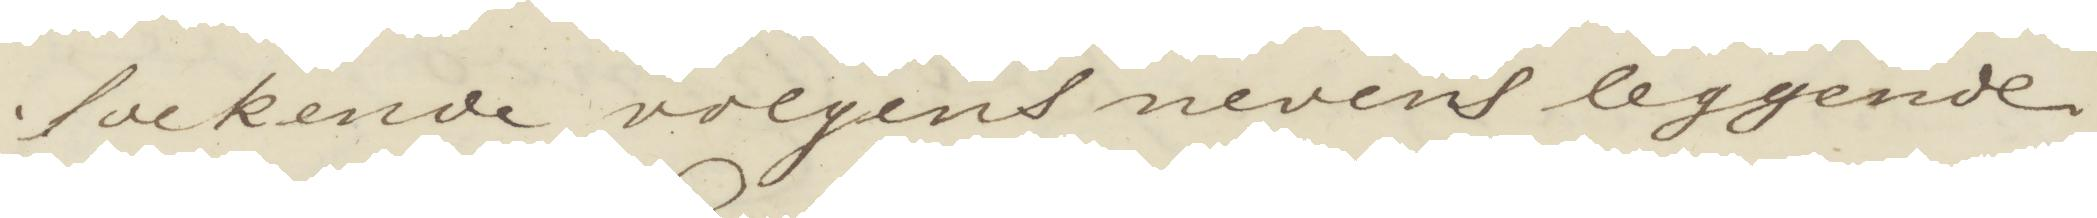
„soekende volgens nevens leggende
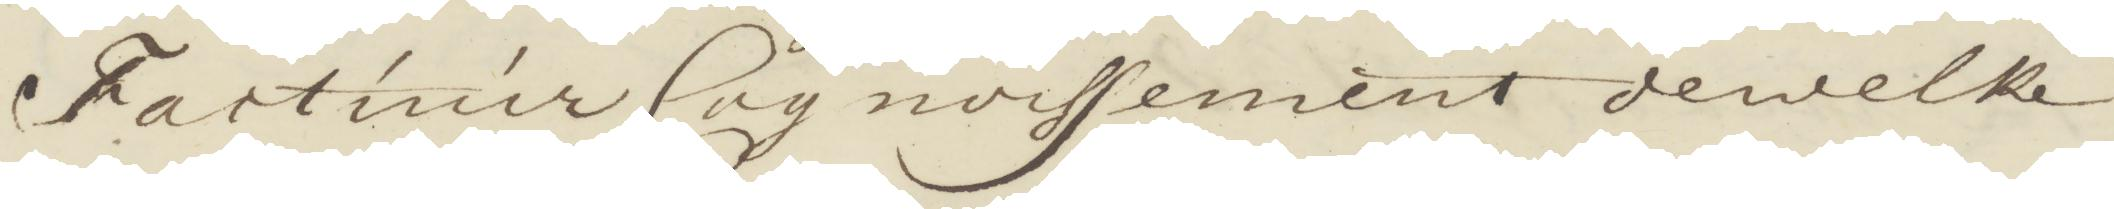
Factuur Cog noissement dewelke
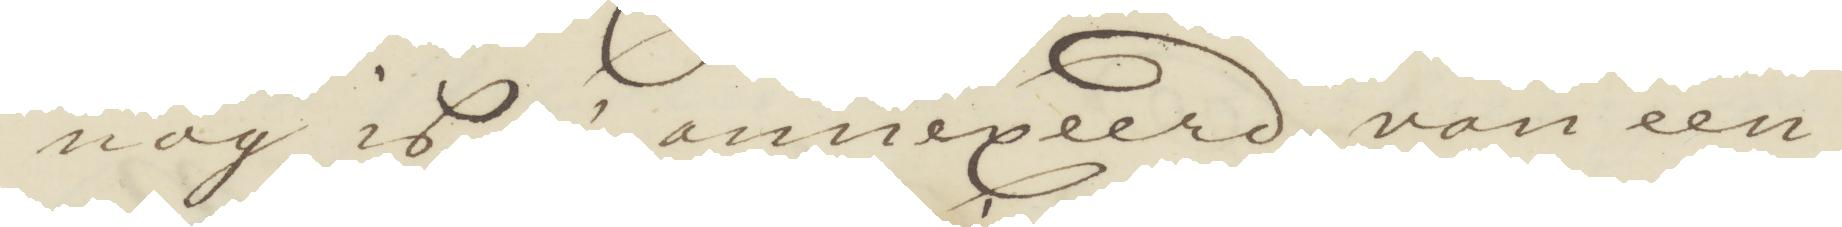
nog is g'annexeerd van een
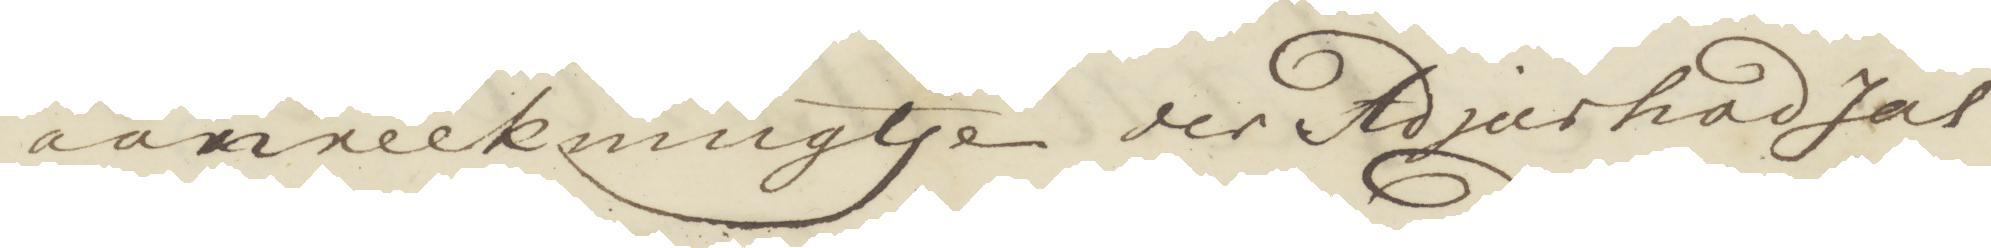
aanreekningtje der Adjarhadjas
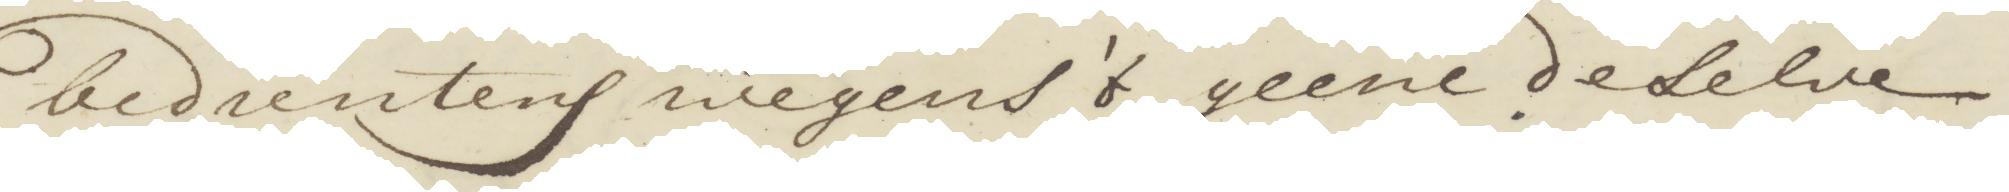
bedientens wegens 't geene deselve
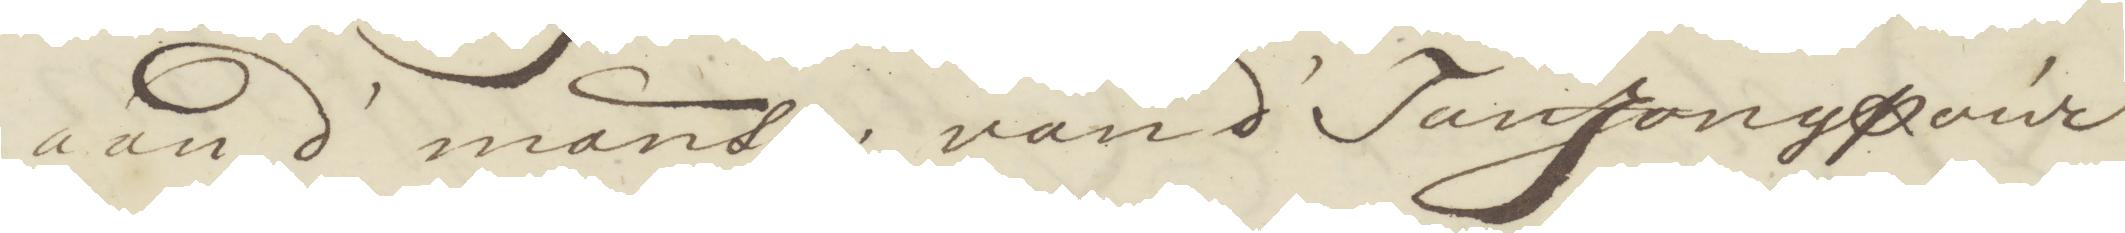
aan d' mansz: van d' Tanjongpour
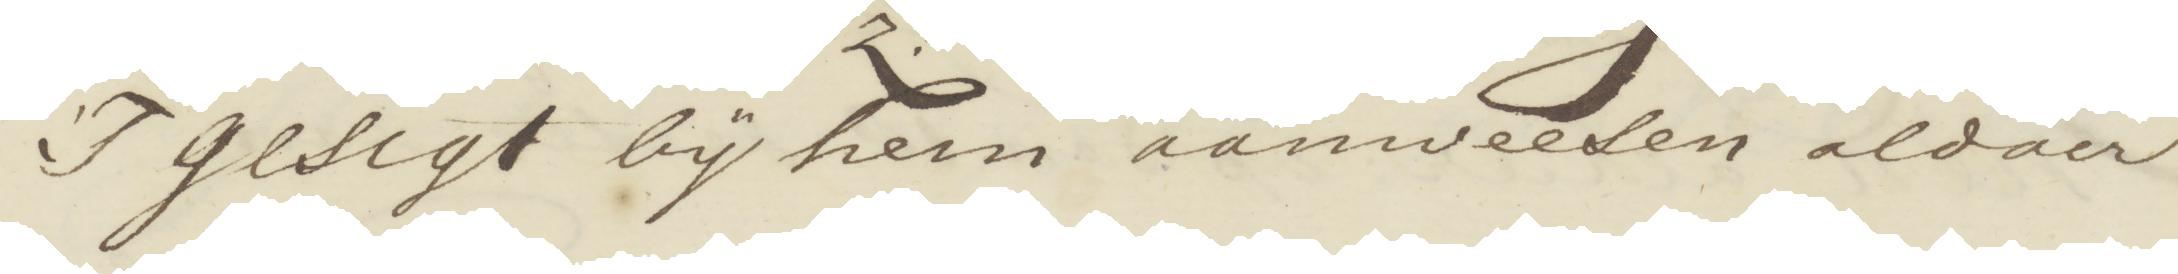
't gesigt bij hem aanweesen aldaer
